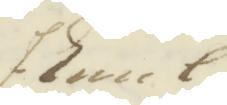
J. Evert
